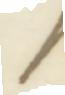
839
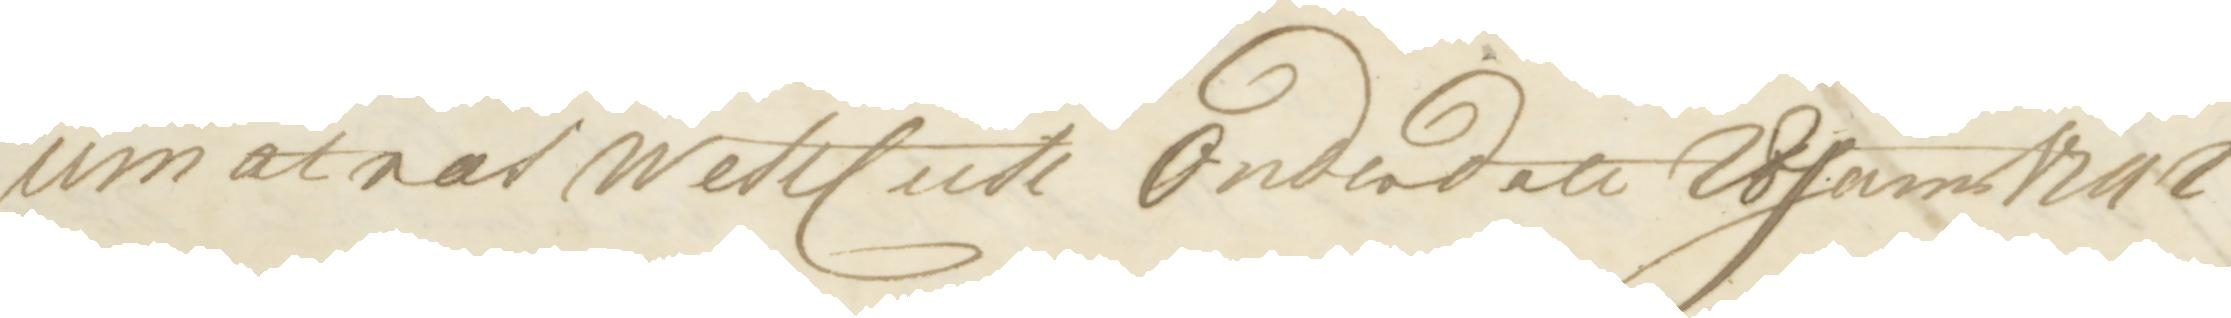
Van Sumatras westcust onder dato 28 Janu 1742
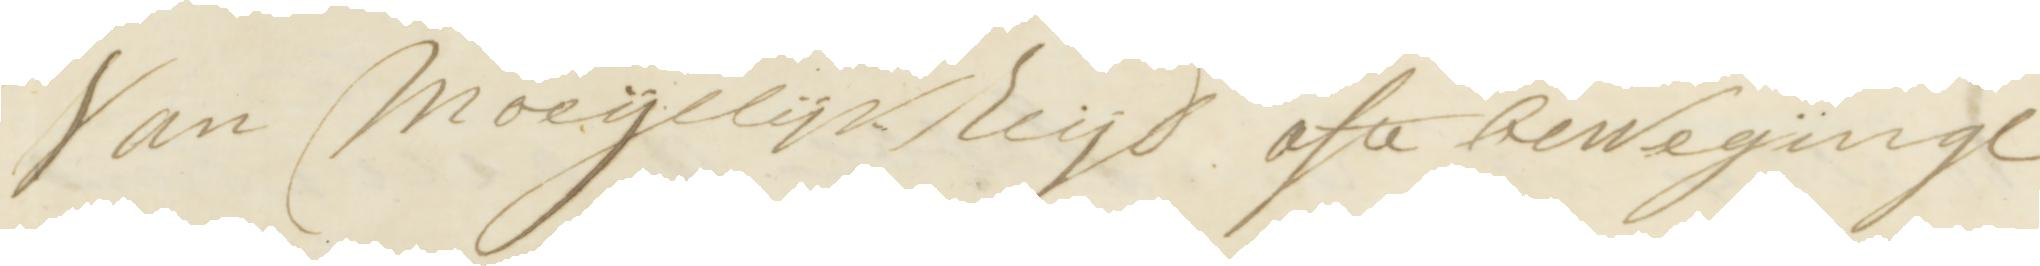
Van moegelijkheijd ofte beweginge
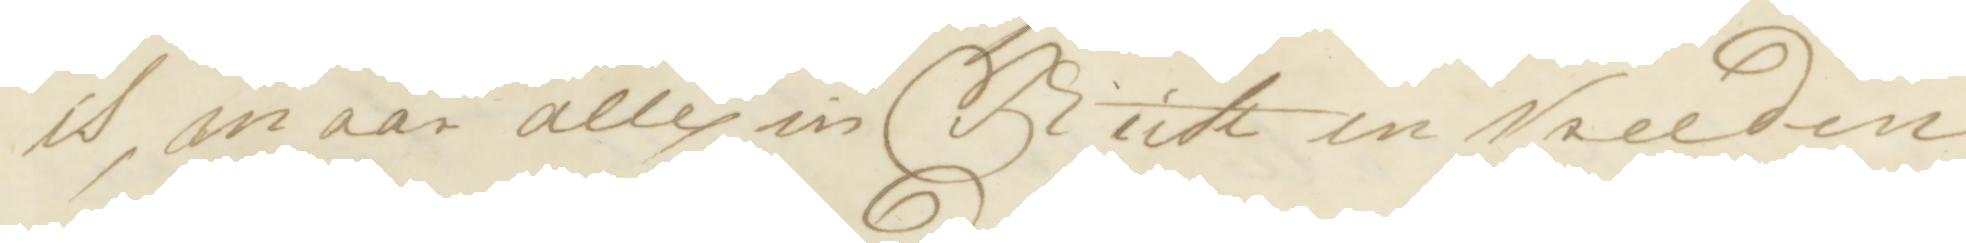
is, om aan alle in Rust en vreeden
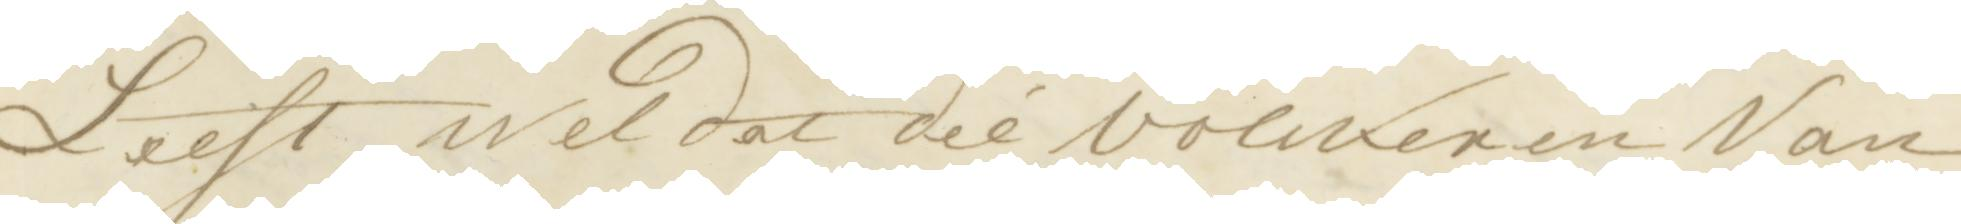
leeft, wel dat die volkeren van
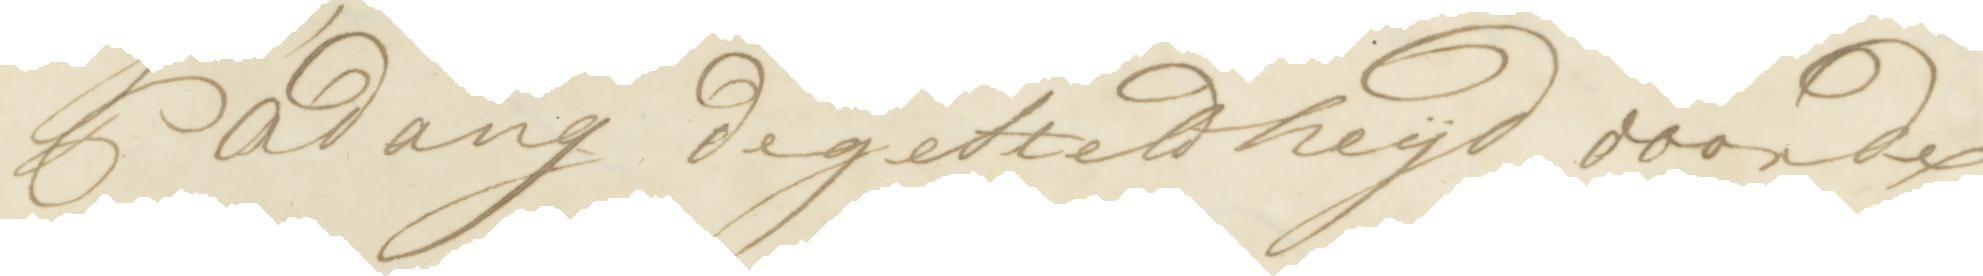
Padang de gesteldheijd door de
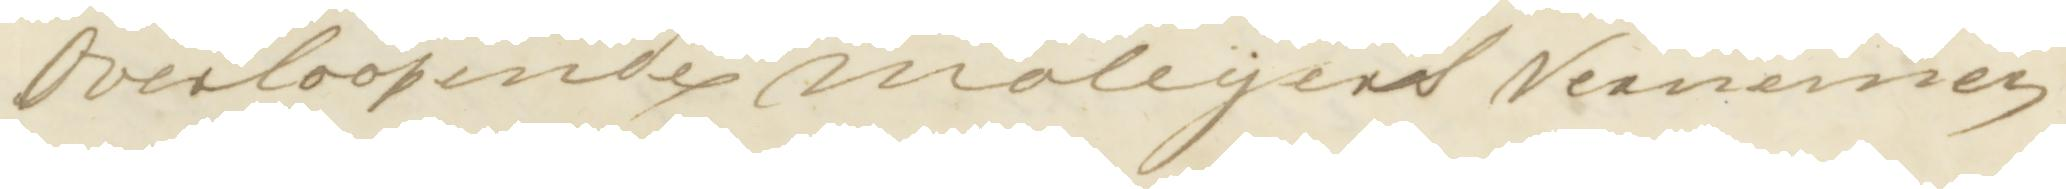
overloopende maleijers vernemen
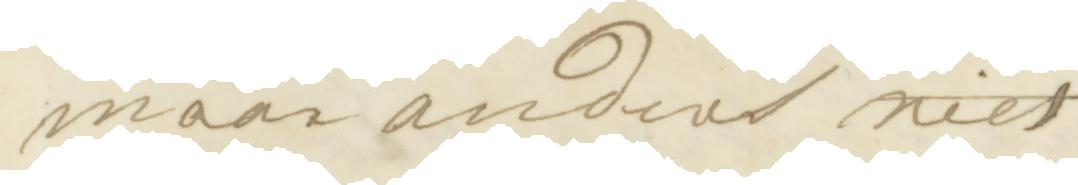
maar anders niet
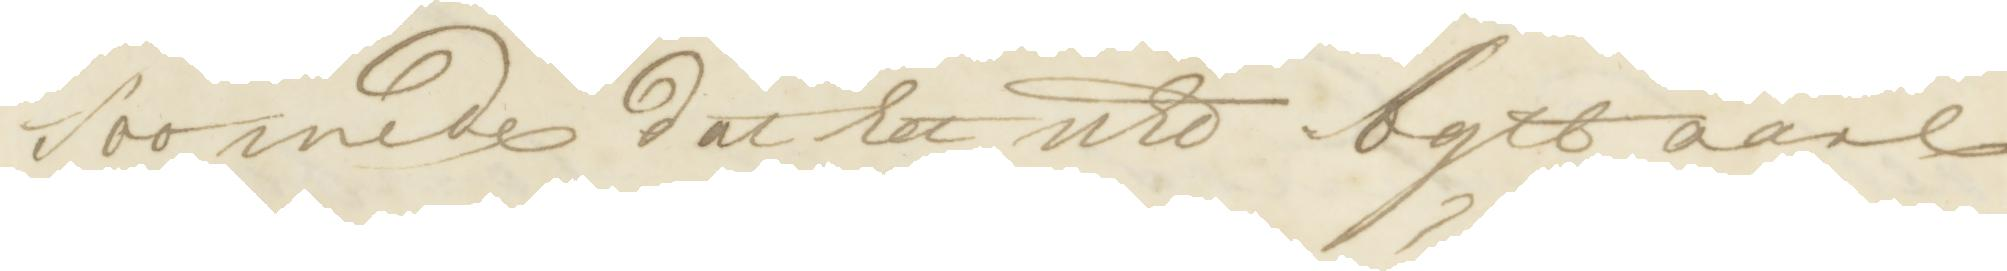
soo mede dat het ued Agtbaare
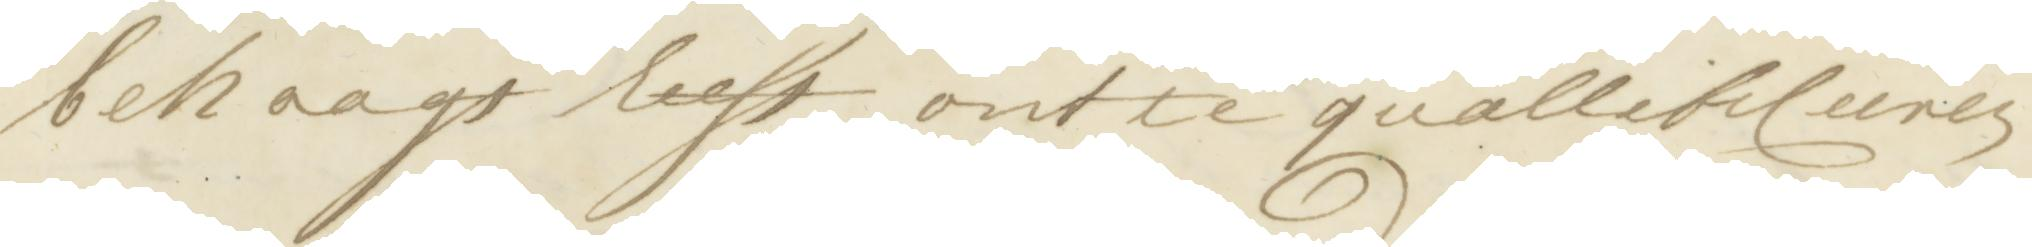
behaagt heeft ons te quallificeeren
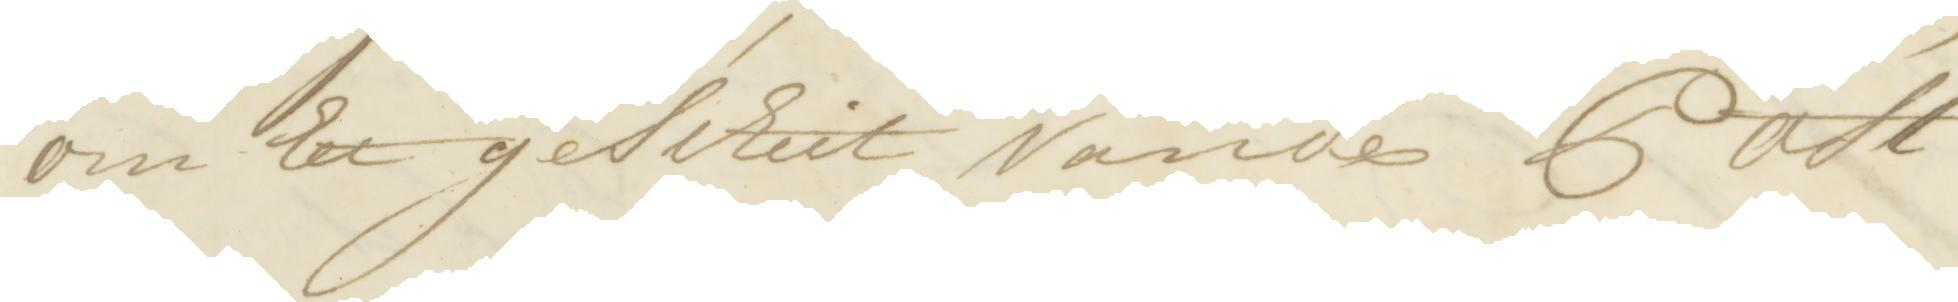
om het geschut vande Post
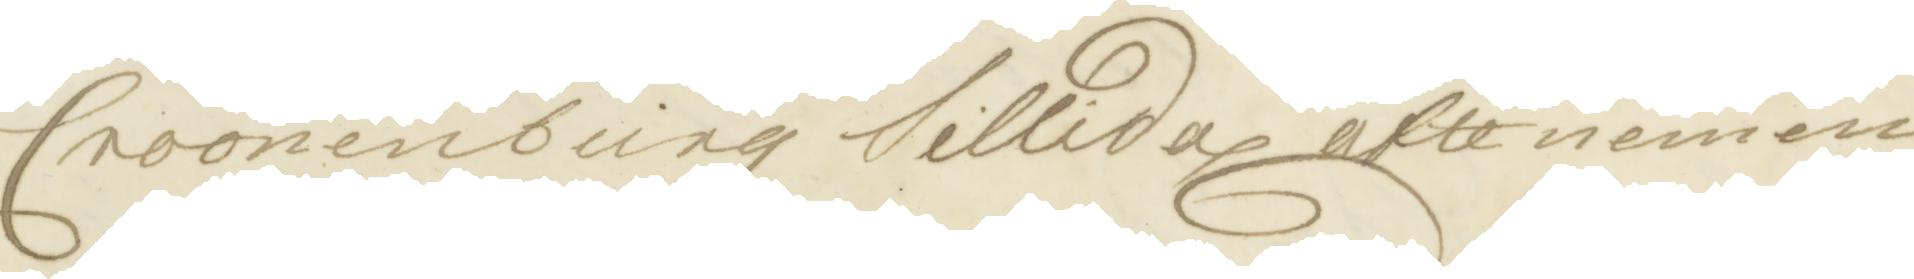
Croonenburg Sillida af te nemen
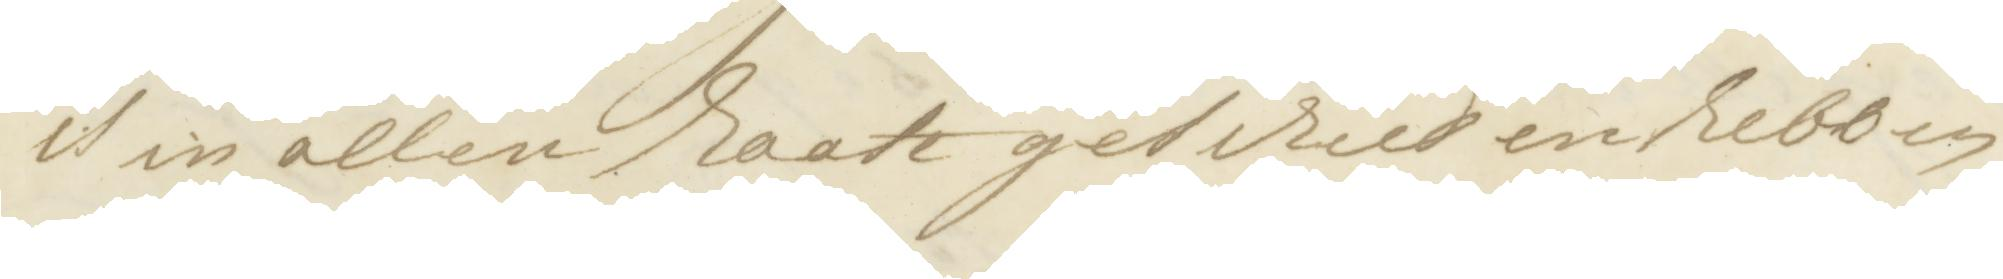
is in allen haast geschied en hebben
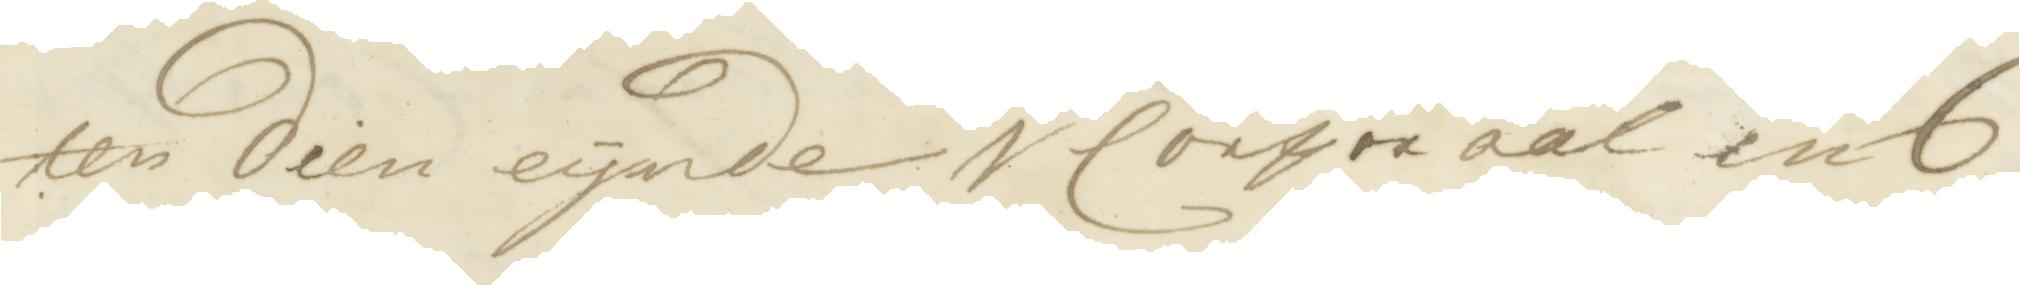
ten dien eijnde 1 corporaal en 6,
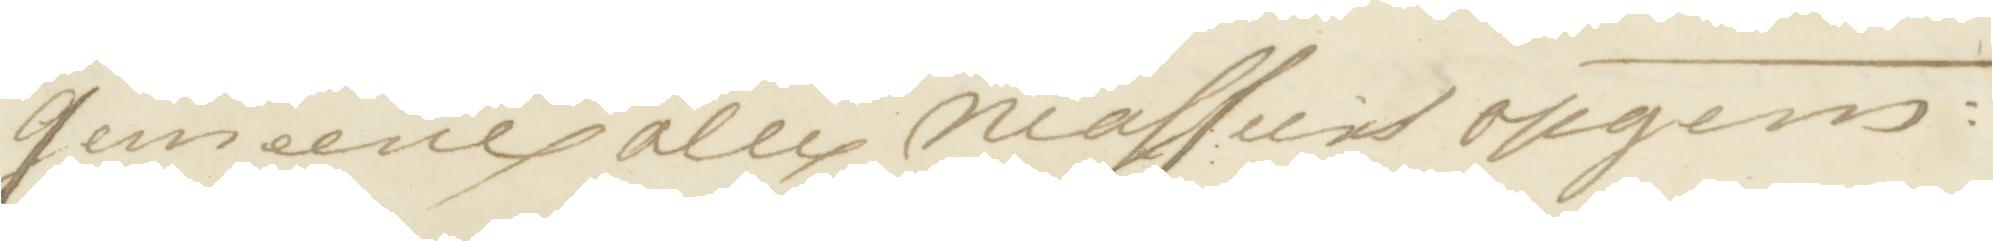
gemeene alle niasseers opgem:
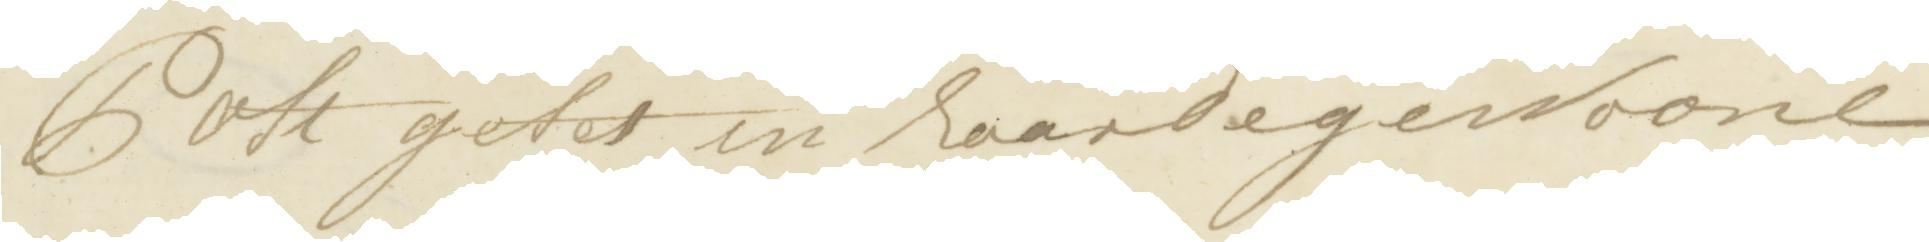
Post geset in haar de gewoone
